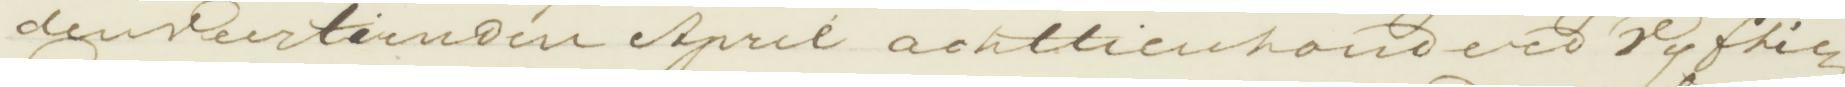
den Veertienden April achttienhonderd Vyftig
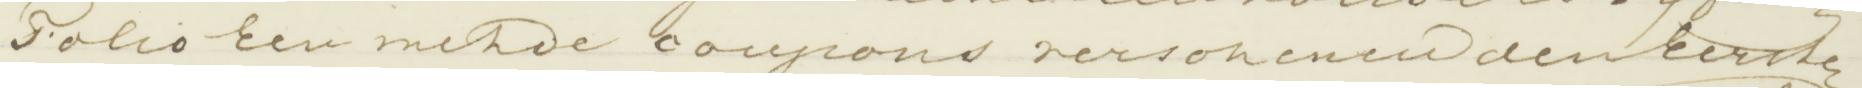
Folio Een metde coupons verschenen den Eersten
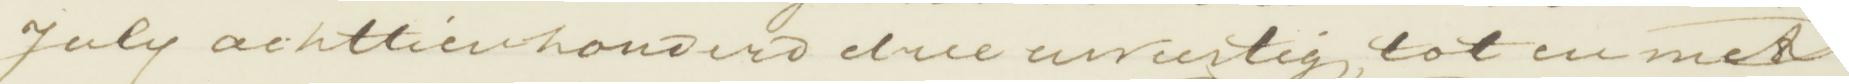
July achttien honderd drie enveertig, tot en met
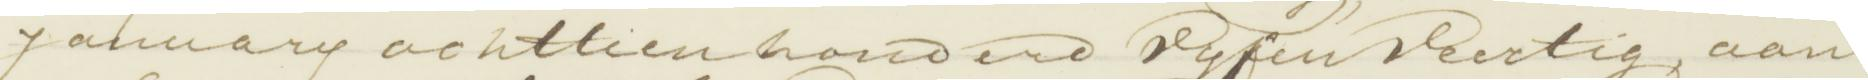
January achttien honderd Vyfen Veertig, aan
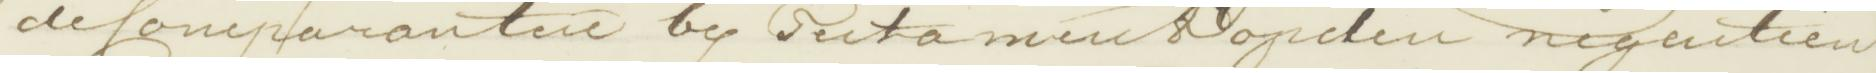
de Comparanten by Testament opden negentien
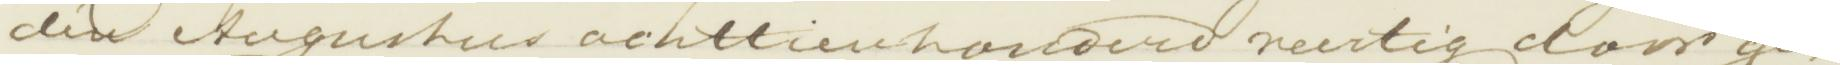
den Augustus achttien honderd veertig door ge,
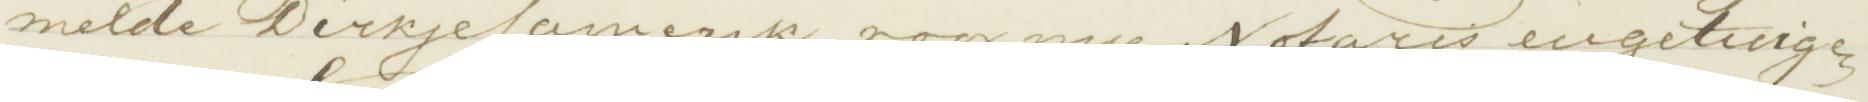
melde Dirkje Camerik voor my Notaris engetuigen
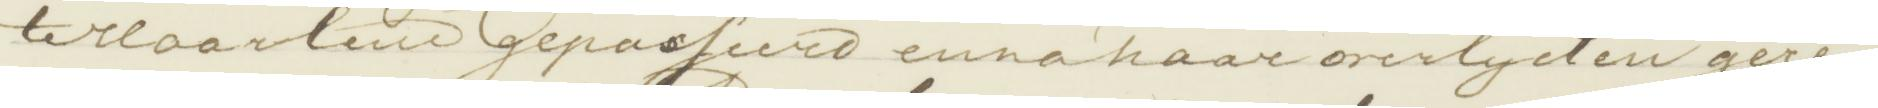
te Haarlem gepasseerd enna haar overlyden gere.
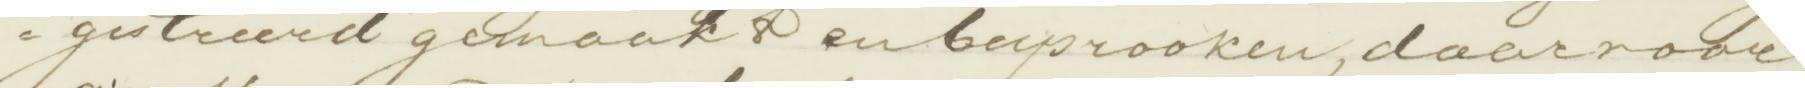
„gistreerd gemaakt en besprooken, daarvoor
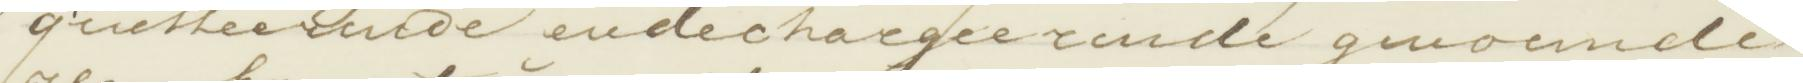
quitteerende en dechargeerende genoemde
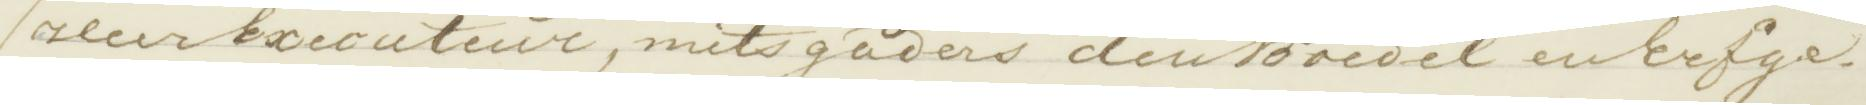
Heer Executeur, mitsgaders den Boedel en Erfge„
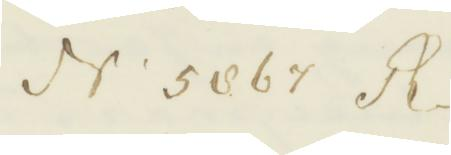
N' 5867 R.
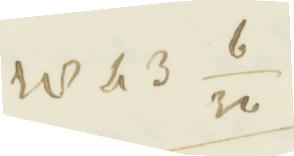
1843 30/6
